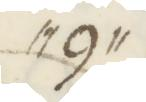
" 9 "
